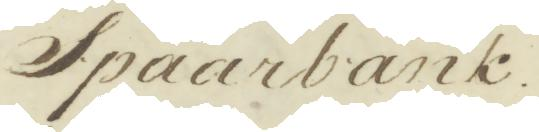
Spaarbank.
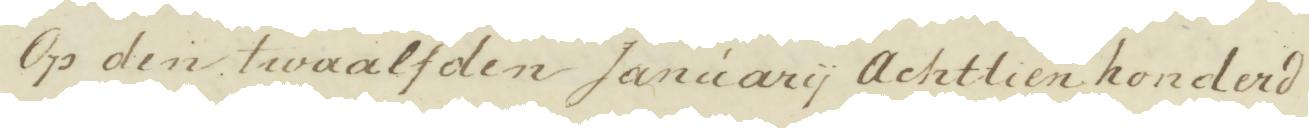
Op den twaalfden Januarij Achttien honderd
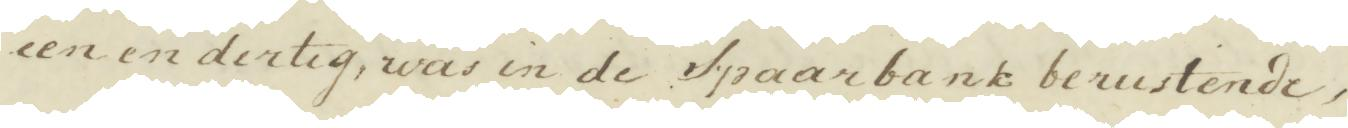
een en dertig, was in de spaarbank berustende,
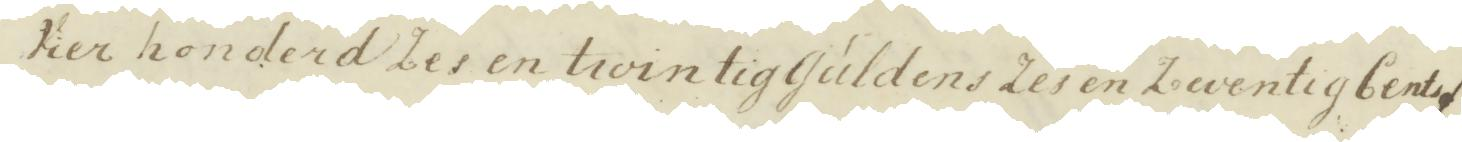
Vier honderd zes en twintig guldens zes en zeventig Cents
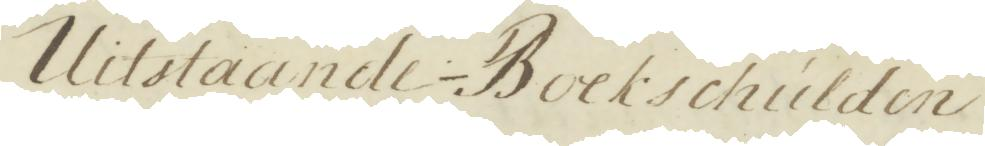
Uitstaande Boekschulden
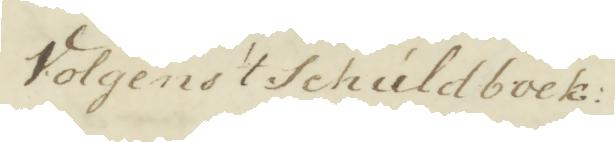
Volgens ’t schuldboek:
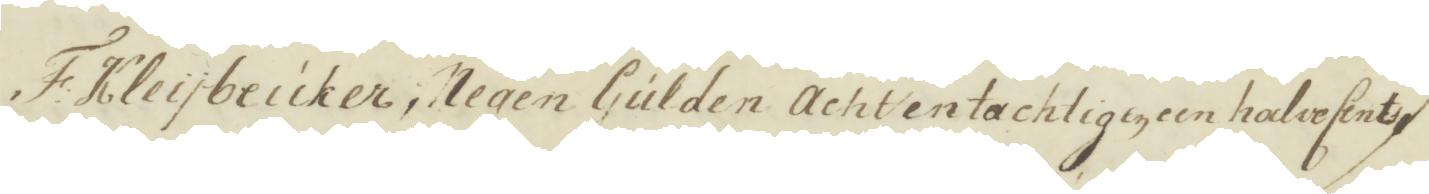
F: Kleijbeuker, negen Gulden acht en tachtig en een halve Cents
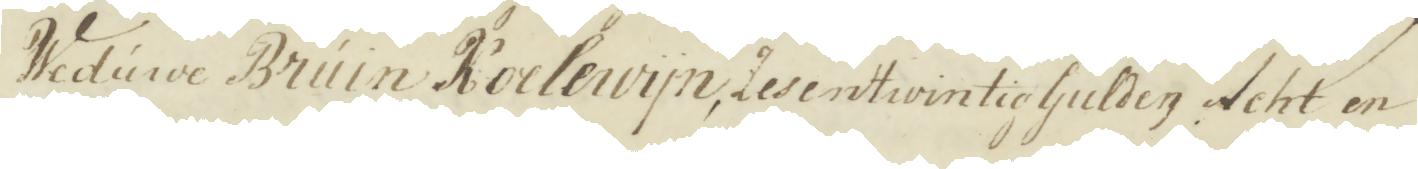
Weduwe Bruin Koelewijn, zesentwintig Gulden Acht en
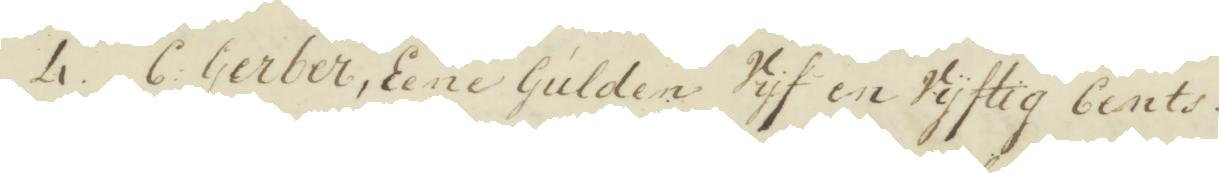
4. C: Gerber, Eene gulden Vijf en Vijftig Cents.
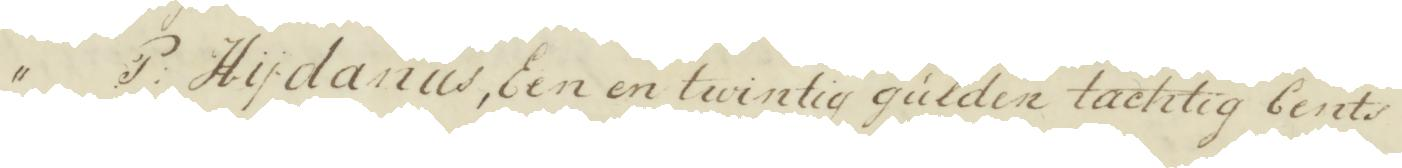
„ F: Hijdanus, Een en twintig gulden tachtig Cents
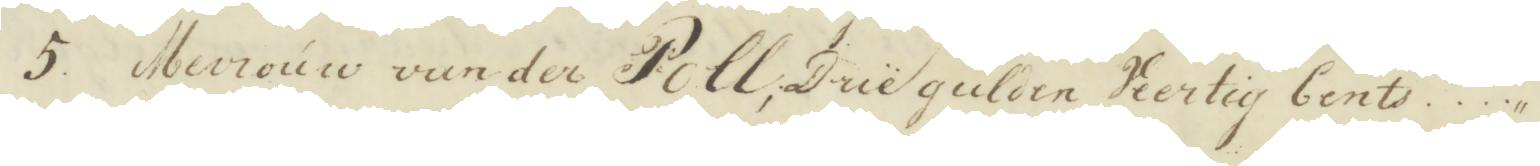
5. Mevrouw van der Poll, Drie gulden Veertig Cents . . . . . „
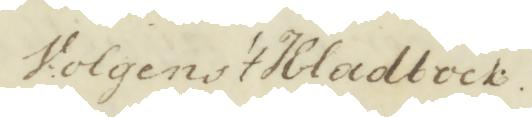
Volgens 't Kladboek.
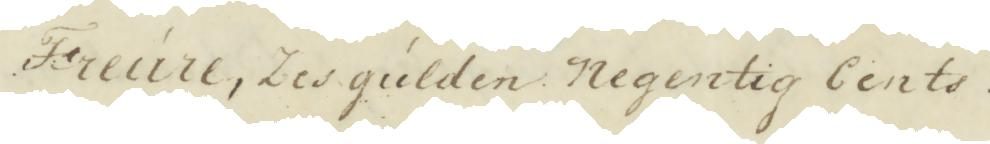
Freure, zes gulden negentig Cents.
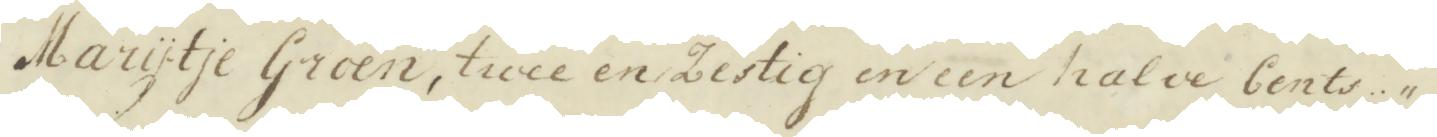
Marijtje Groen, twee en Zestig en een halve Cents . . „
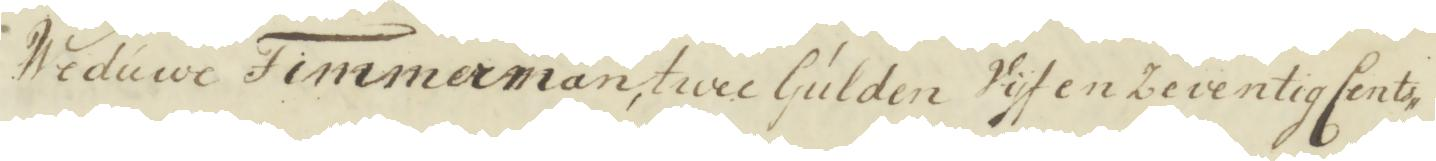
Weduwe Timmerman, twee Gulden Vijf en Zeventig Cents„
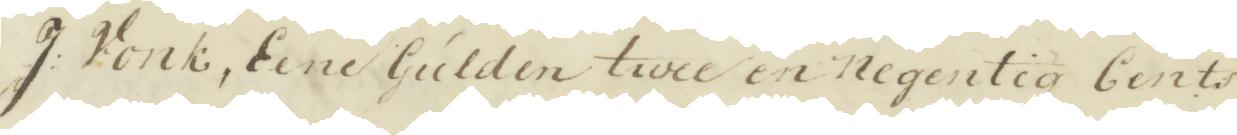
J: Vonk, Eene Gulden twee en negentig Cents
